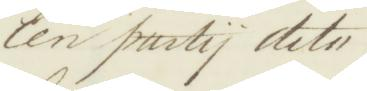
Een partij dito
